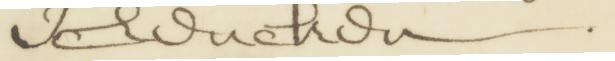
schencken.
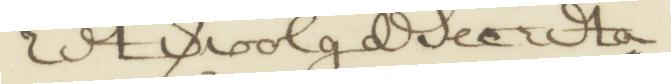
het vervolg de secreta
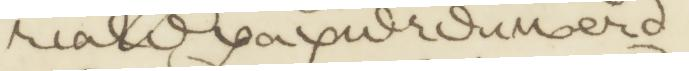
riale papieren werd
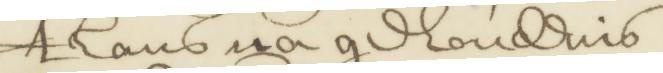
thans na gehoudenis
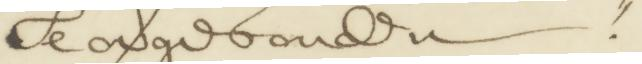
se overgesonden."
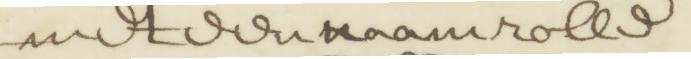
met een naam rolle
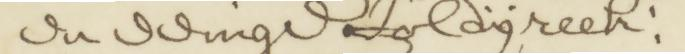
en eenige soldijreek:
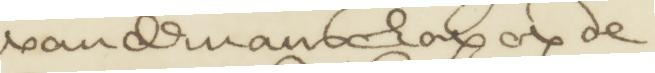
van de manschap op de
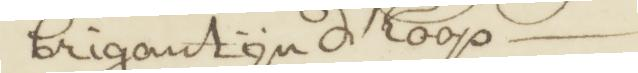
brigantijn d'Hoop
